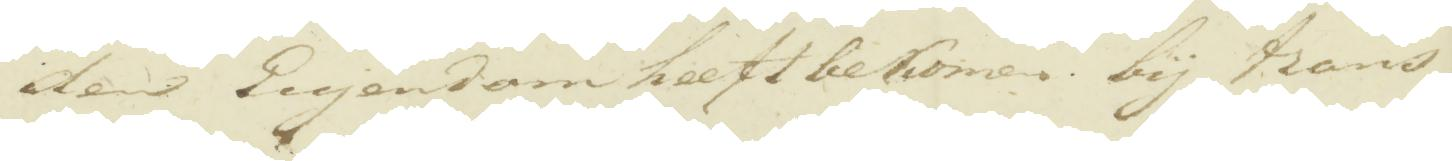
den Eigendom heeft bekomen bij trans
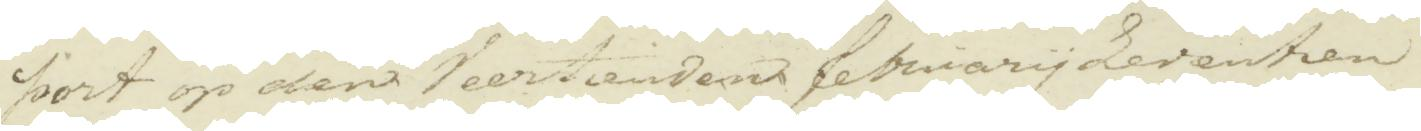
port op den Veertienden februarij Zeventien
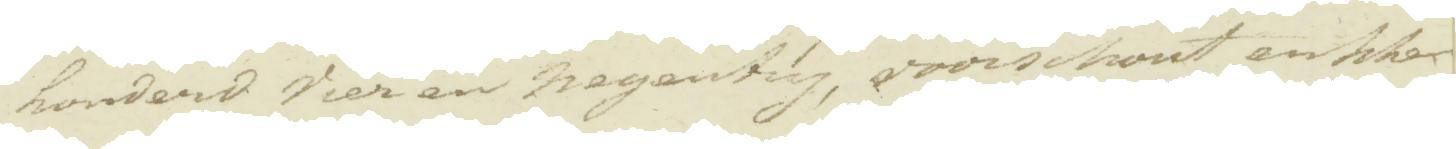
honderd vier en negentig, voor schout en sche
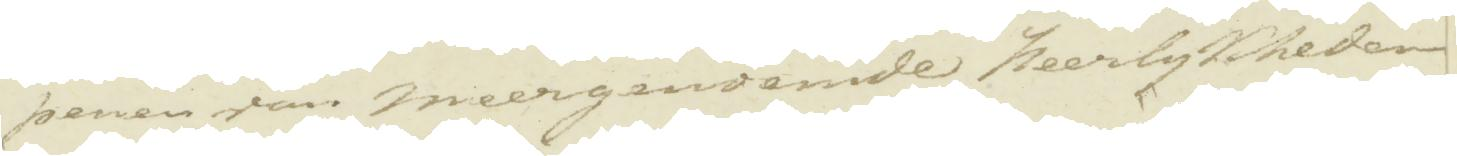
penen van meergenoemde heerlykheden
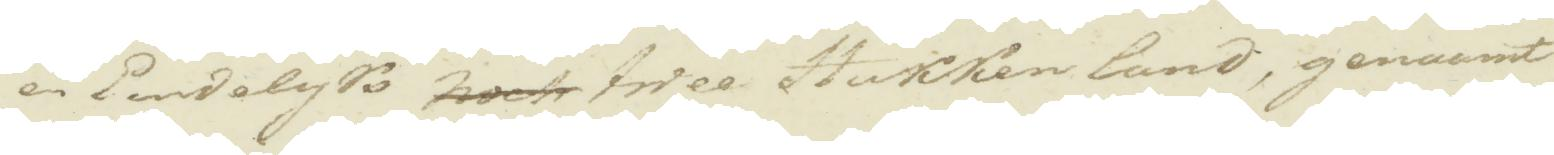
en Eendelijk noch twee stukken land, genaamt
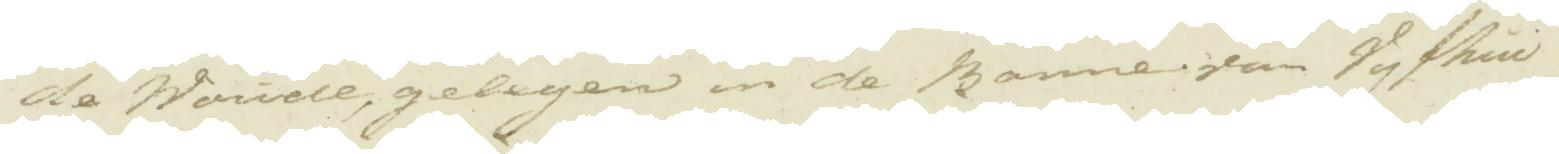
de Woude, gelegen in de Banne van Vyfhui
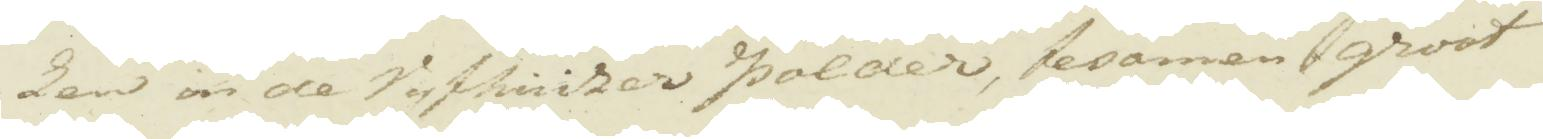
zen in de Vyfhuizer Polder, tesamen groot
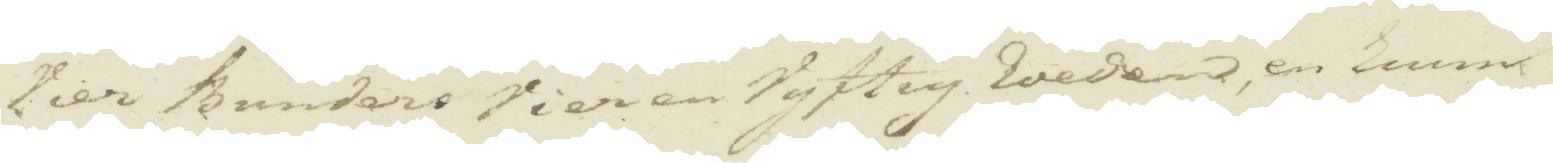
Vier Bunders Vier en Vyftig Roeden, en Ruim
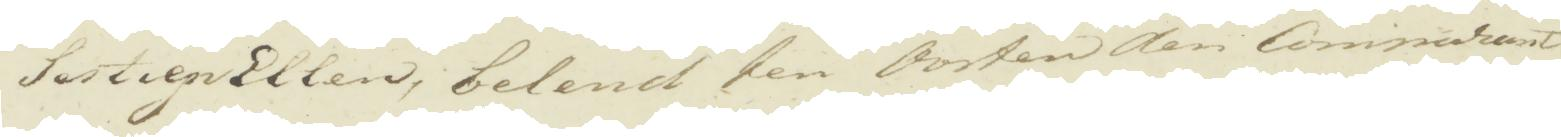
Sestien Ellen, belend ten Oosten den Comparant
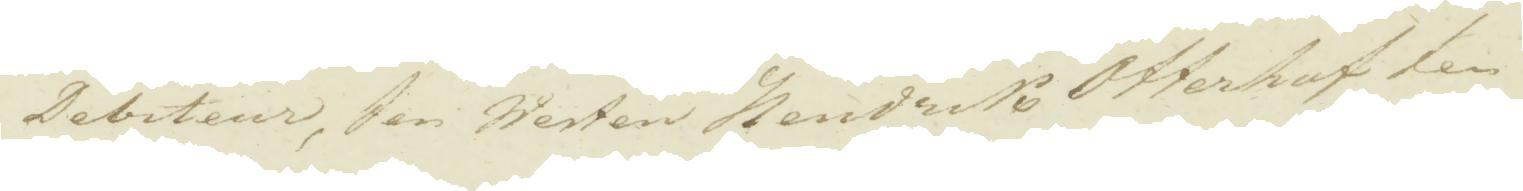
Debiteur, ten Westen Hendrik Otterhof ten
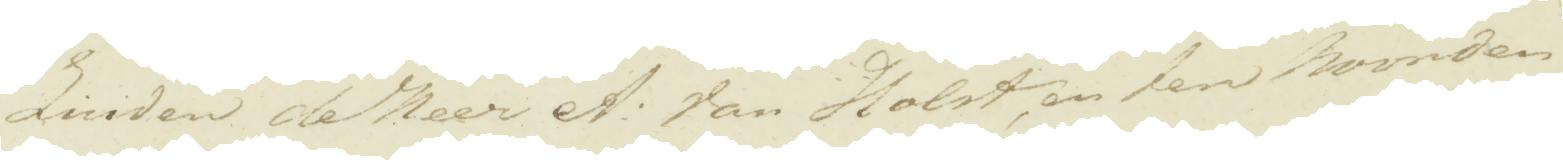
Zuiden de Heer A: van Holst, en ten Noorden
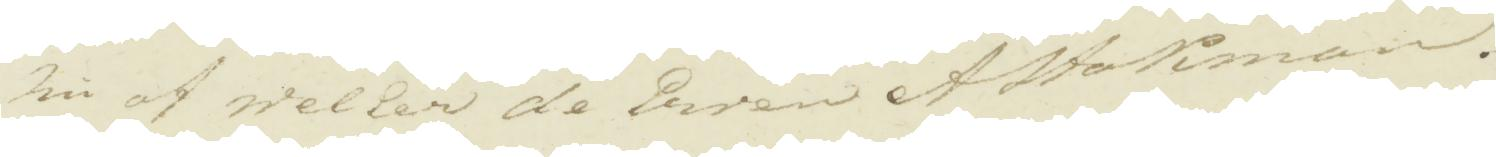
nu of weleer de Erven A Stokman.
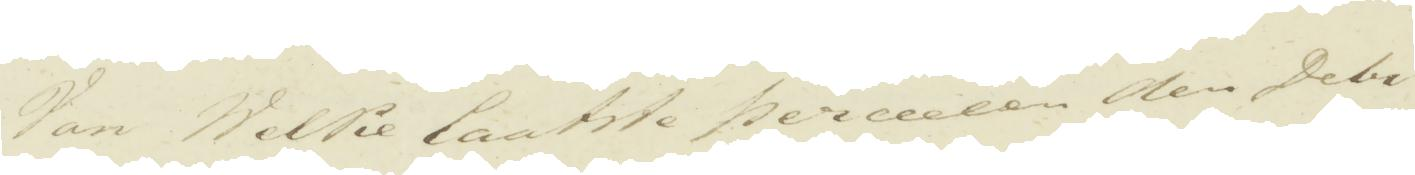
Van Welke laatste perceelen den Debi
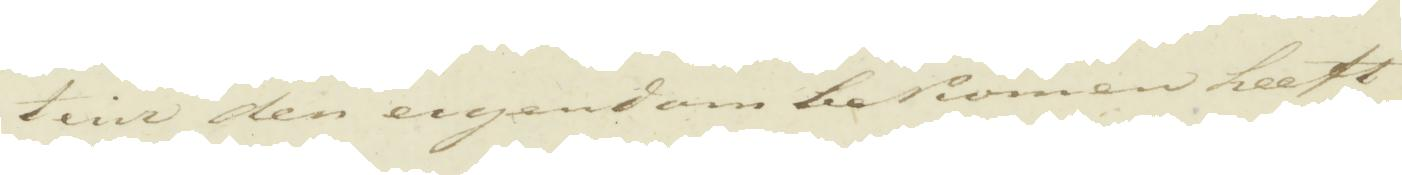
teur den eigendom bekomen heeft
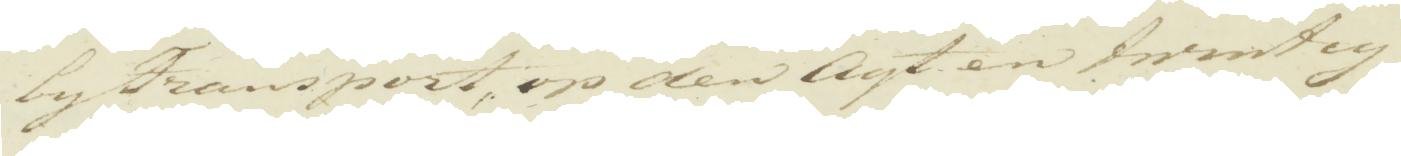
by Transport, op den Agt en twintig
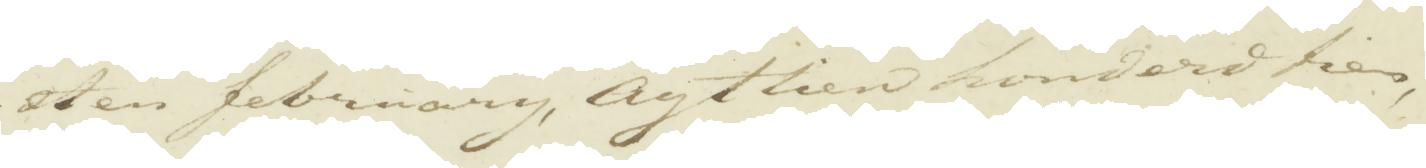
sten february, agttien honderd tien,
